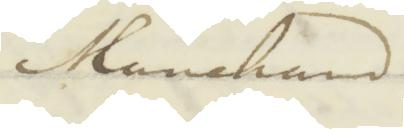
Marchand
